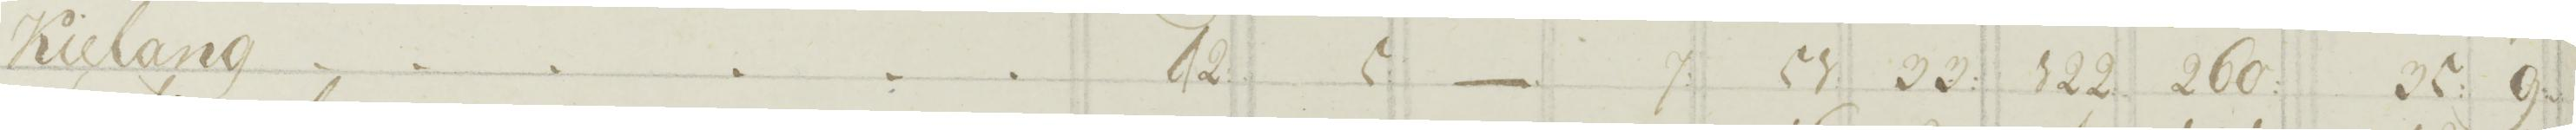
Kielang - - - - - - 42: 5: —. 7: 51: 33: 122: 260: 35: 9:.
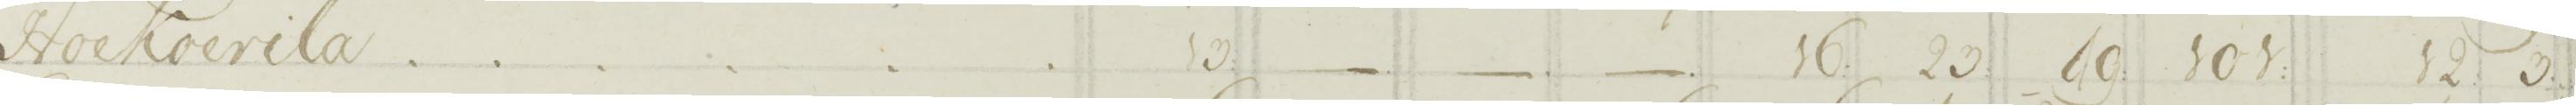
Hoekoerila - - - - - - 13: —. —. —. 16: 23: 49: 101: 12: 3:.
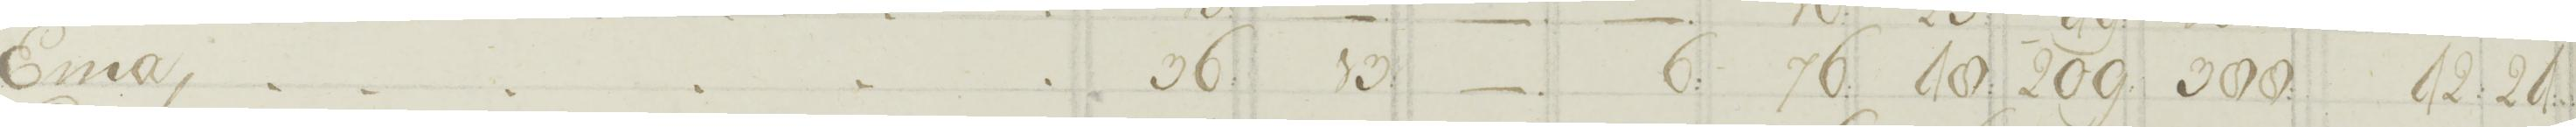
Ema - - - - - - 36: 13: —. 6: 76: 48: 209: 388: 42: 24:.
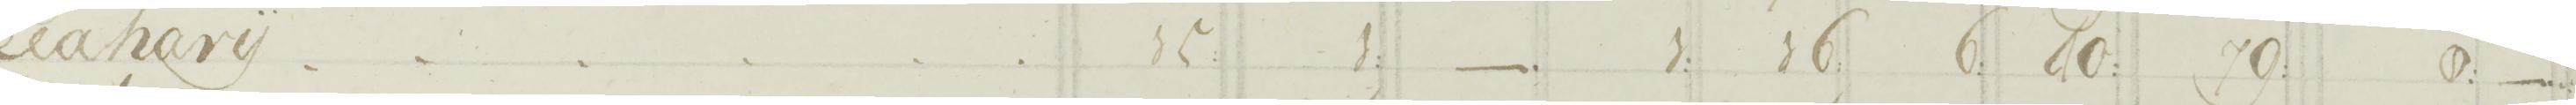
Leaharij - - - - - - 15: 1: —. 1: 16: 6: 40: 79: 8: —..
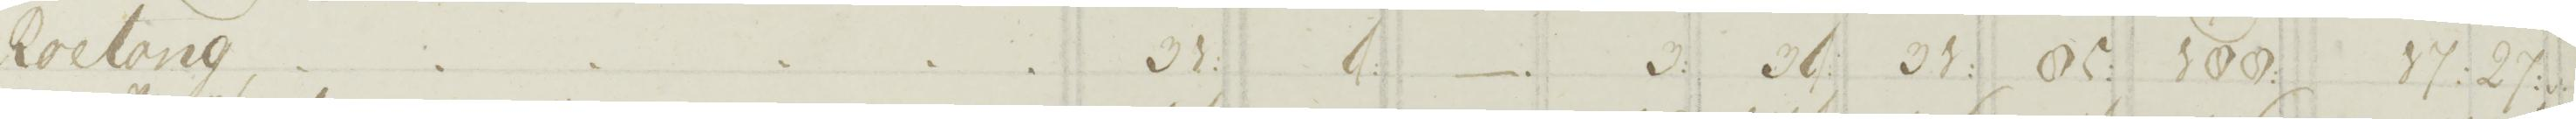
Roetong - - - - - - 31: 4: —. 3: 34: 31: 85: 188: 17: 27:-:
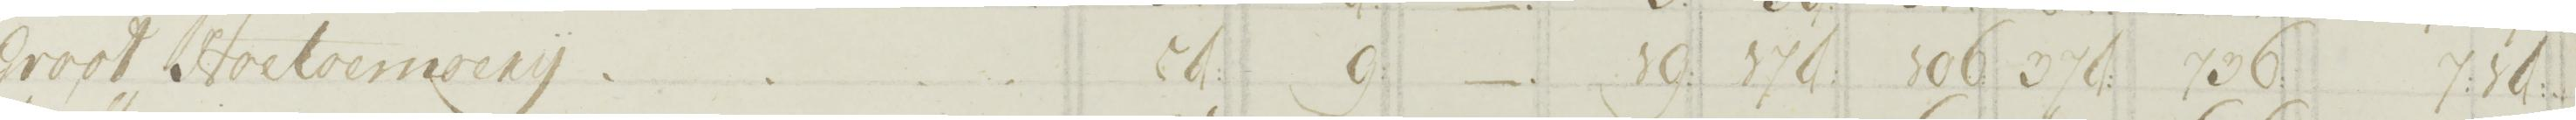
Groot Hoetoemoerij - - - - 54: 9: —. 19: 174: 106: 374: 736: 7:14:-:
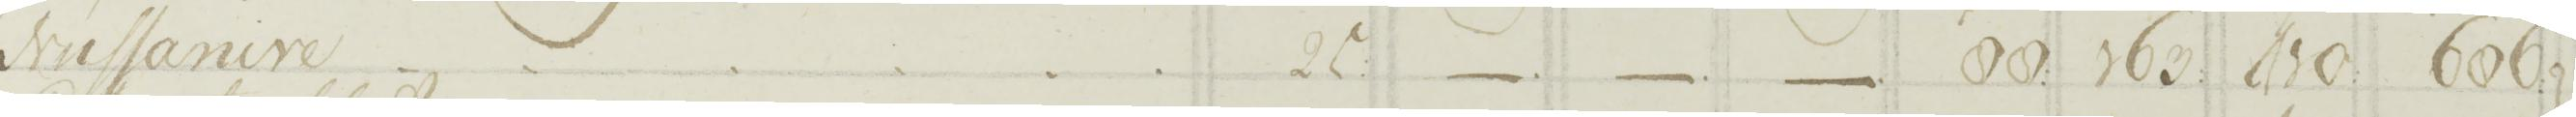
Nussanive - - - - - - 25: —. —. —. 88: 163: 410: 686:
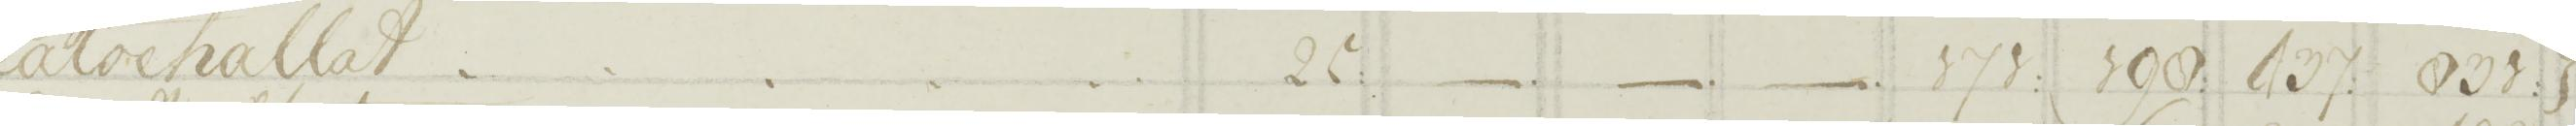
Latoehallat - - - - - 25: —. —. —. 171: 198: 437: 831:}
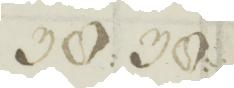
38: 38:-
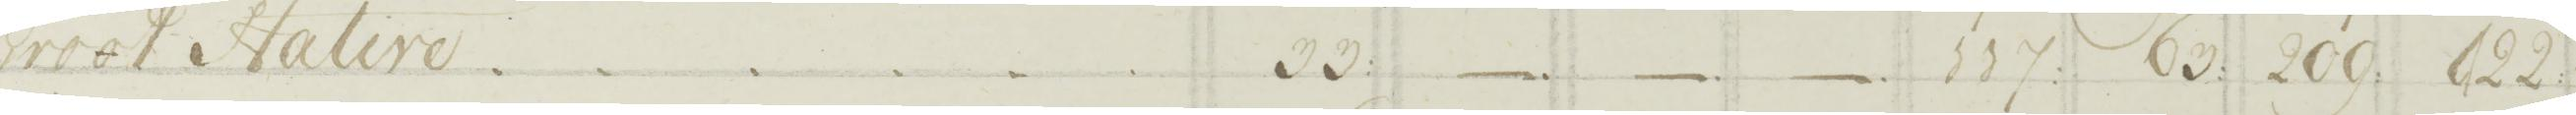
Groot Hative - - - - - - 33: —. —. —. 117: 63: 209: 422:
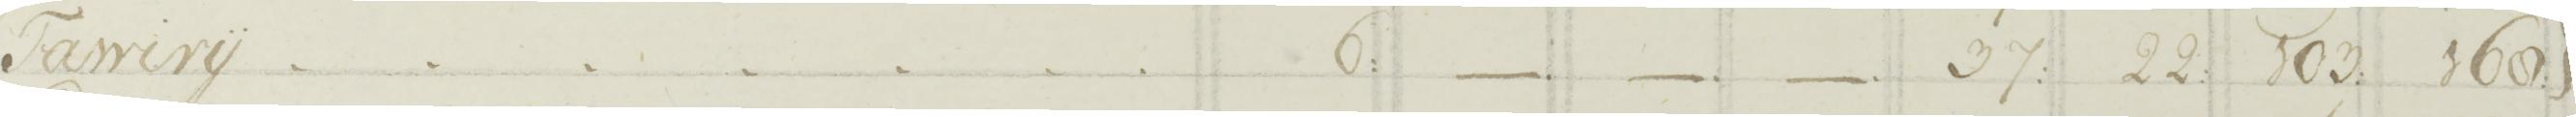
Tawirij - - - - - - - 6: —. —. —. 37: 22: 103: 168:}
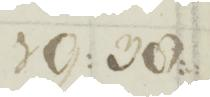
19: 38:.:
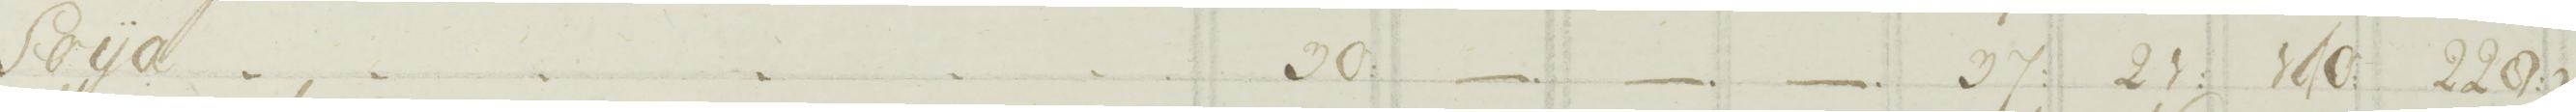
Soija - - - - - - 30: —. —.—. 37: 21: 140: 228:
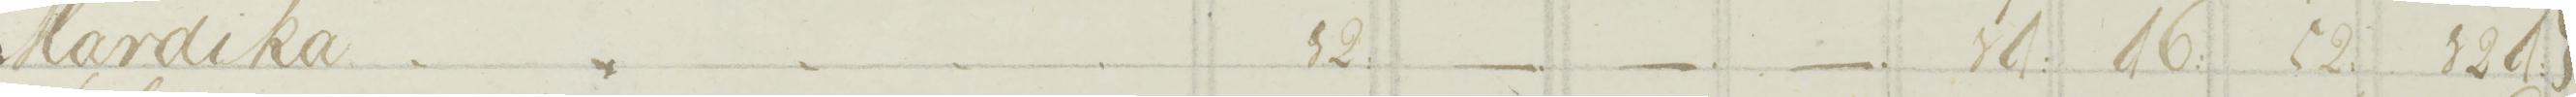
Mardika - - - - - 12: —. —. —. 14: 46: 52: 124:
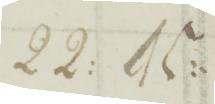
22: 45:.
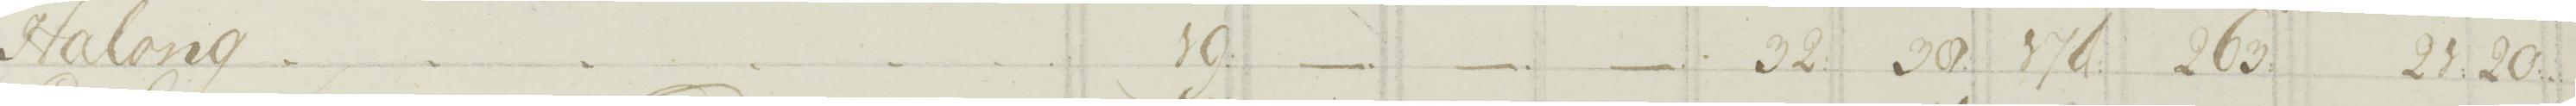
Halong - - - - - - 19: —. —. —. 32: 38: 174: 263: 21: 20:.:
